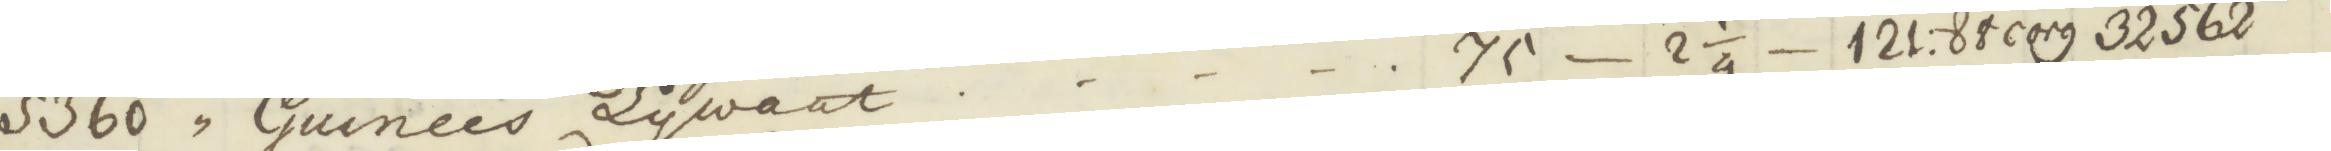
5360 „ Guinees Lijwaat - - - - . 75 — 2¼ — 121:8 t'corg 32562
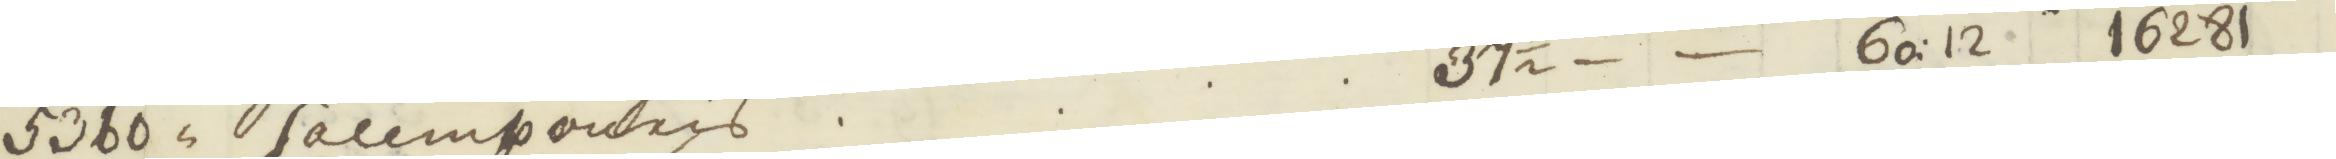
5360 „ Salempouris . . . . 37½ — — 60:12 16281
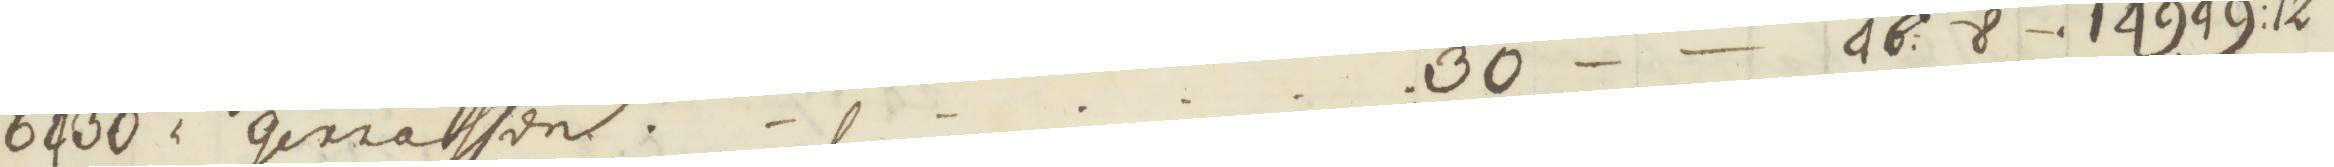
6430 „ gerrassen. - - - - - -30 — — 48: 8 -. 14949:12
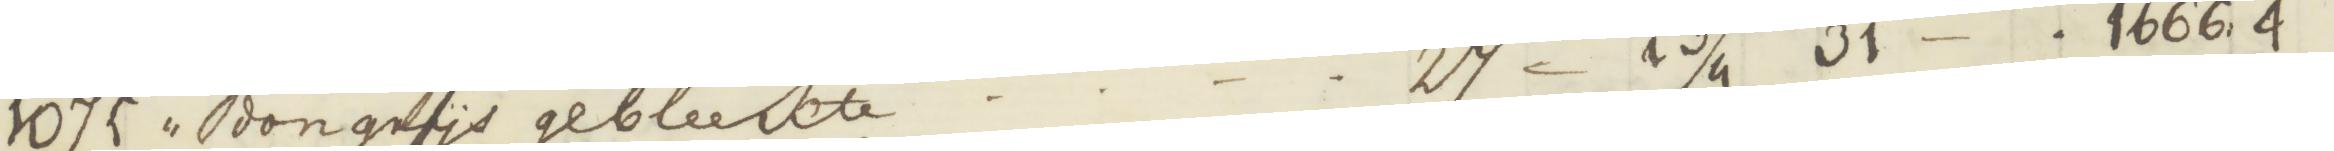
1075 „ dongrijs gebleekte - - - - 27 — 1¾ 31 — . 1666:4
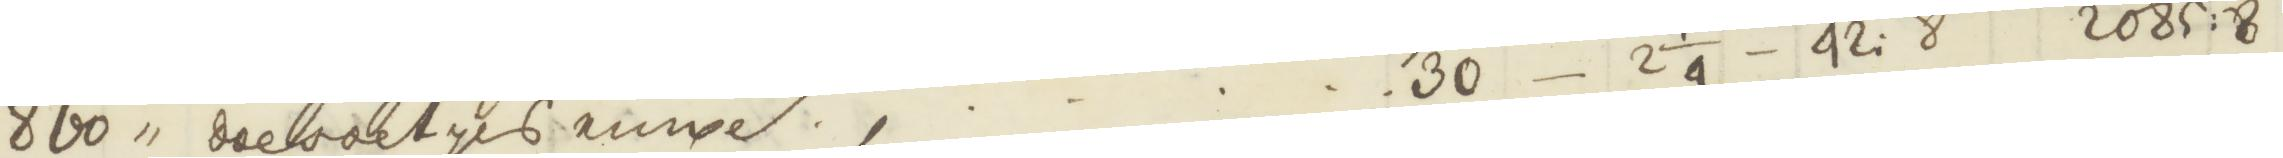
860 „ doesoetjes ruwe . . . . . . 30 — 2¼ — 42: 8 2085:8
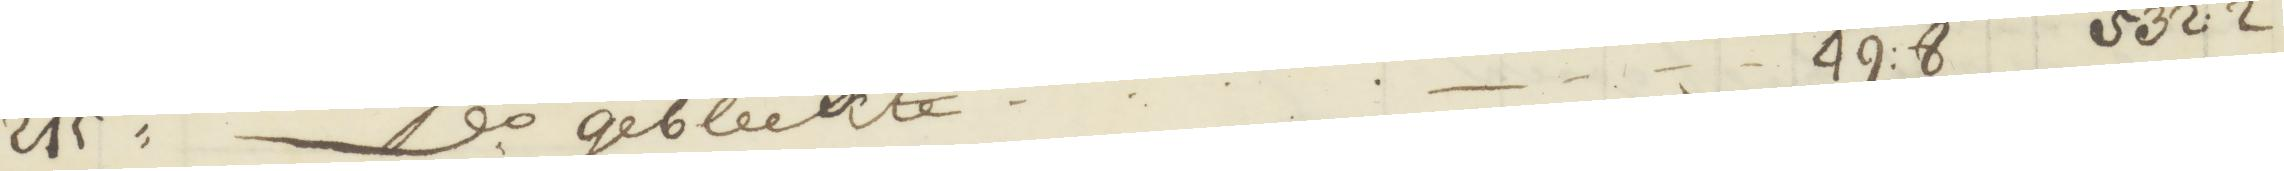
215 „ _/o gebleekte . . . . — — — — 49:8 532:2
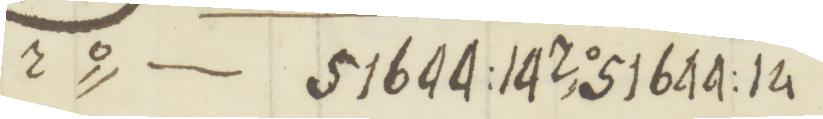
r„o — 51644:14r„o51644:14
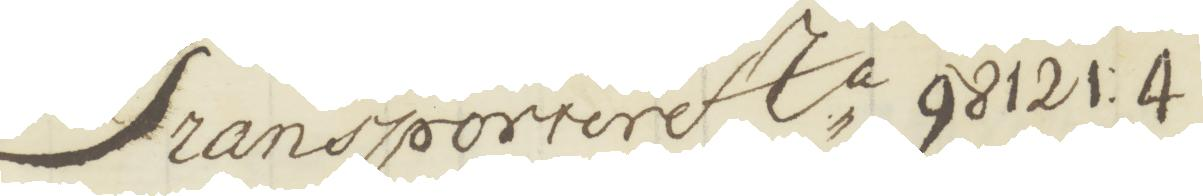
Transportere R„a 98121: 4
